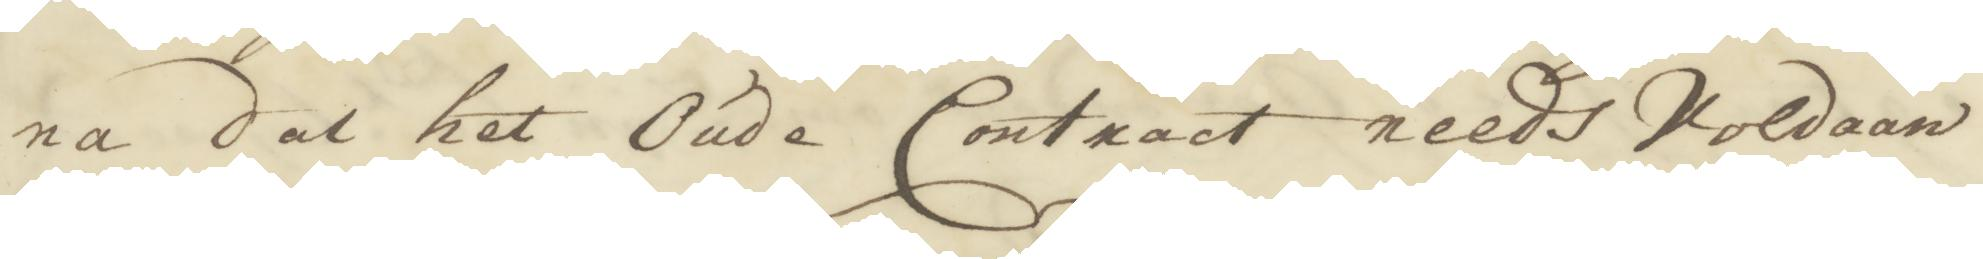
na dat het Oude Contract reeds voldaan
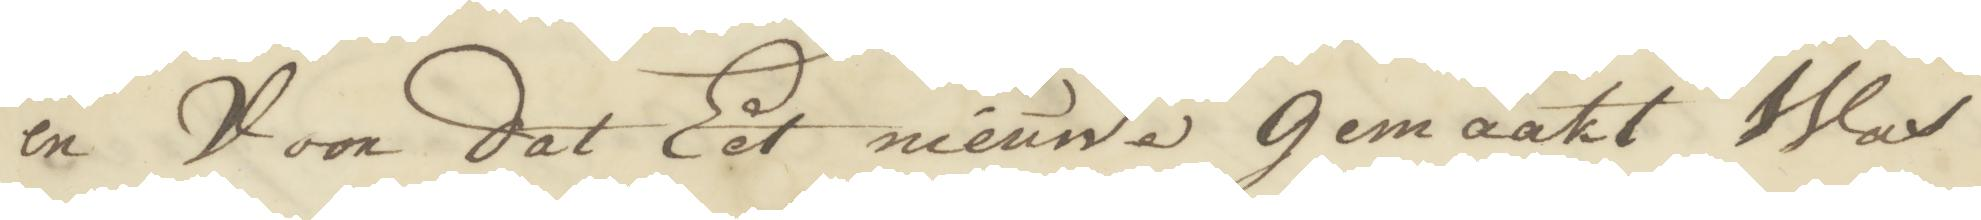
en voor dat het nieuwe gemaakt Was
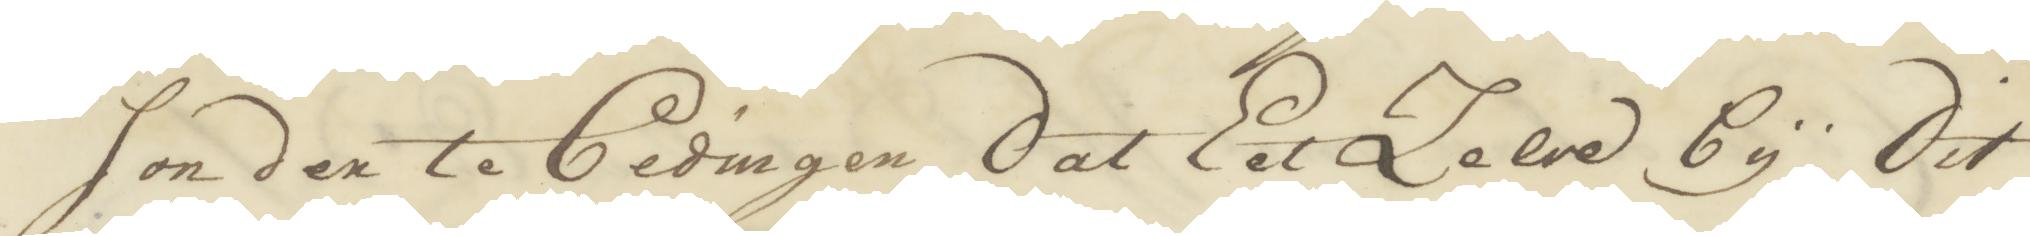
sonder te bedingen dat het zelve bij dit
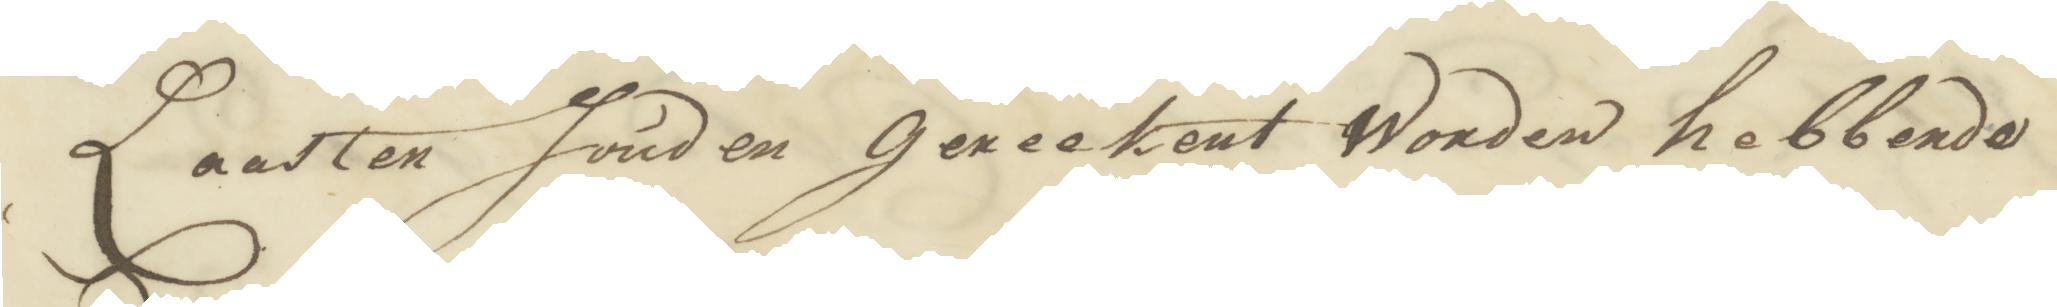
Laasten souden gereekent worden hebbende
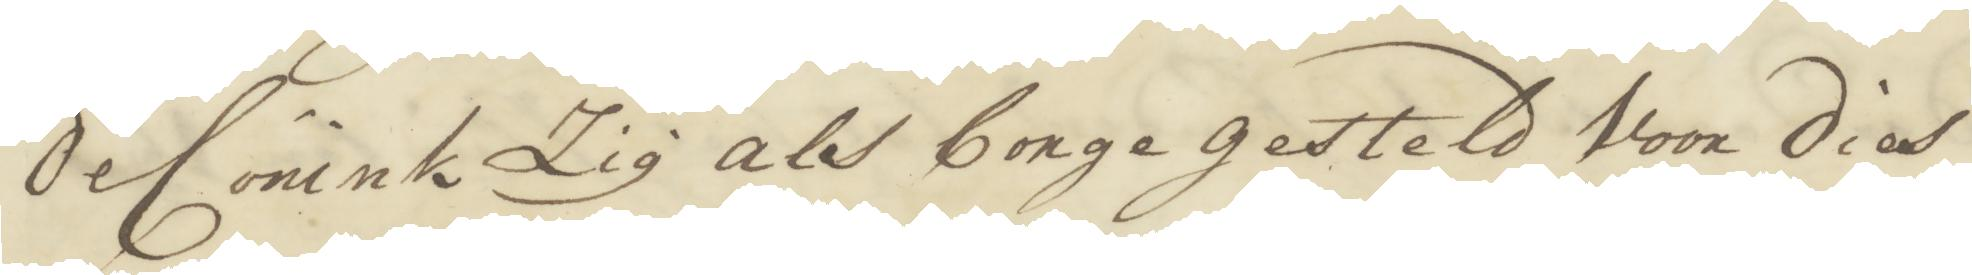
de Conink zig als borge gesteld voor dies
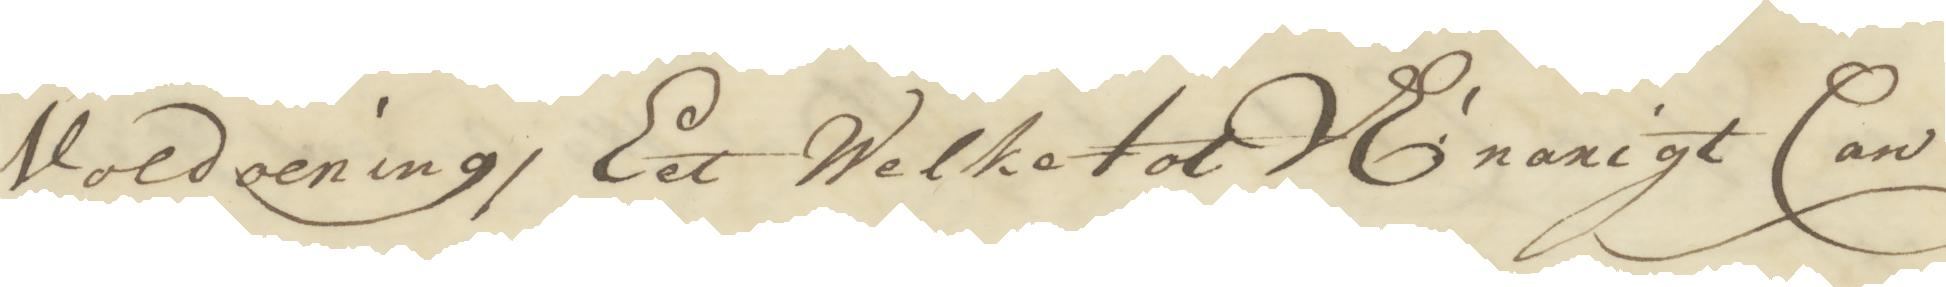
Voldoening, het welke toe VE narigt Can
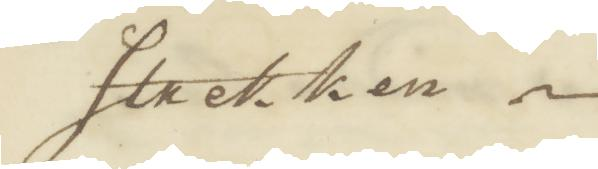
strekken —
